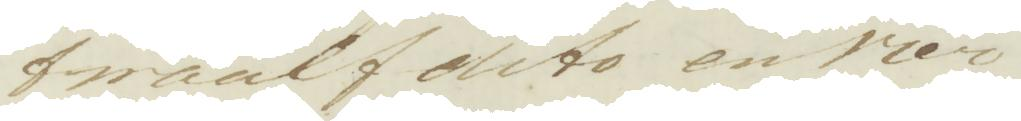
twaalf dito en vier
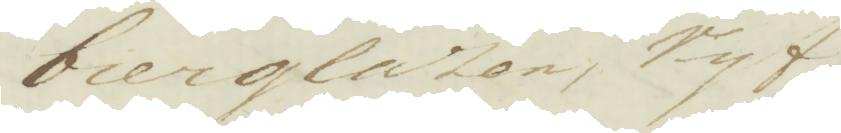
bierglazen, Vyf
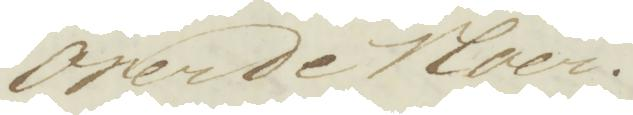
over de Vloer.
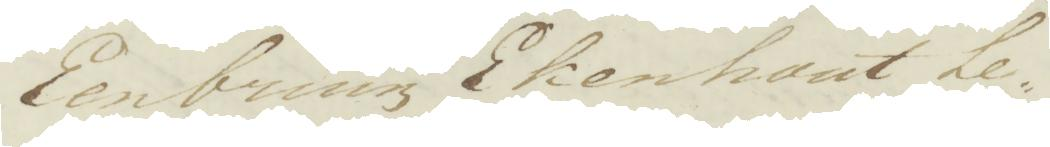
Een bruin Ekenhout Le„
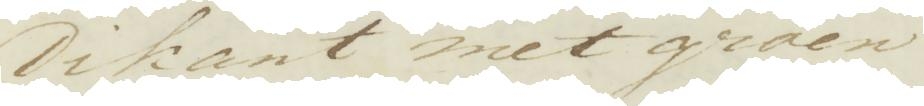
dikant met groen
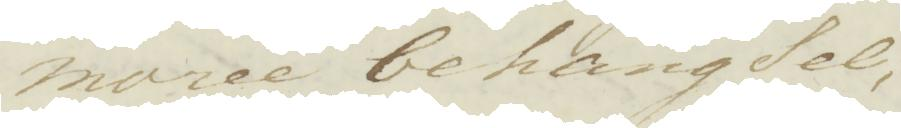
moree behangsel,
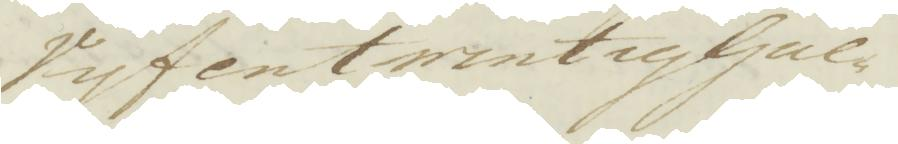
Vyf en twintig Gul„
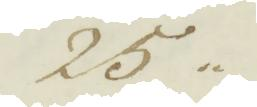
25 „ —
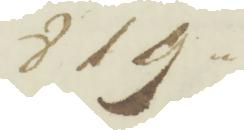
ƒ 819 „ —
